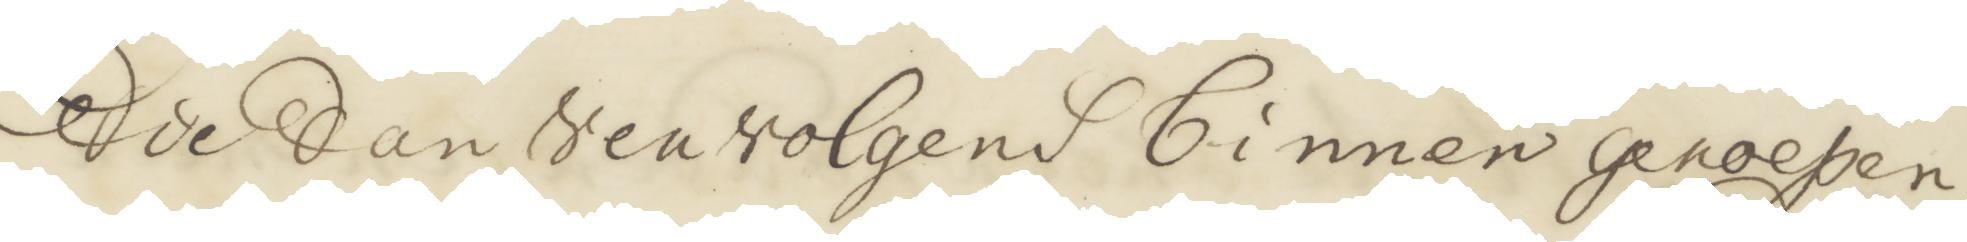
die dan vervolgens binnen geroepen
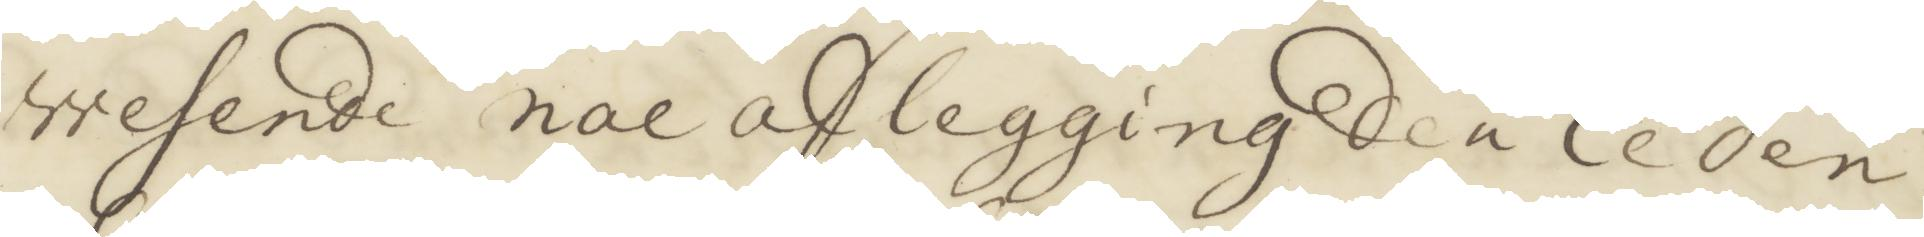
wesende nae aflegging der Eeden
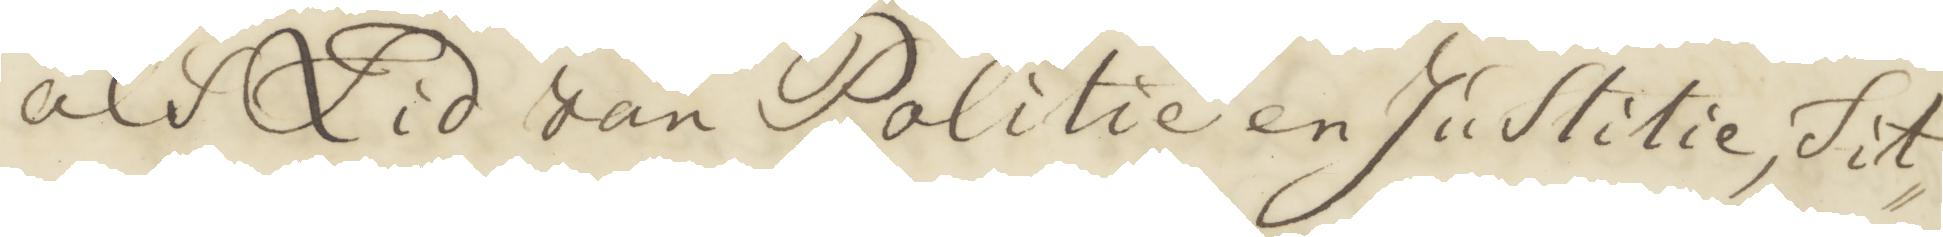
als Lid van Politie en Justitie, sit„
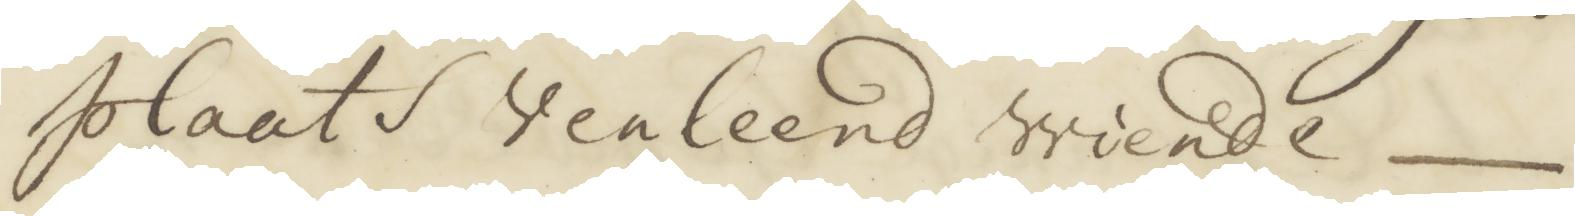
plaats verleend wierde —
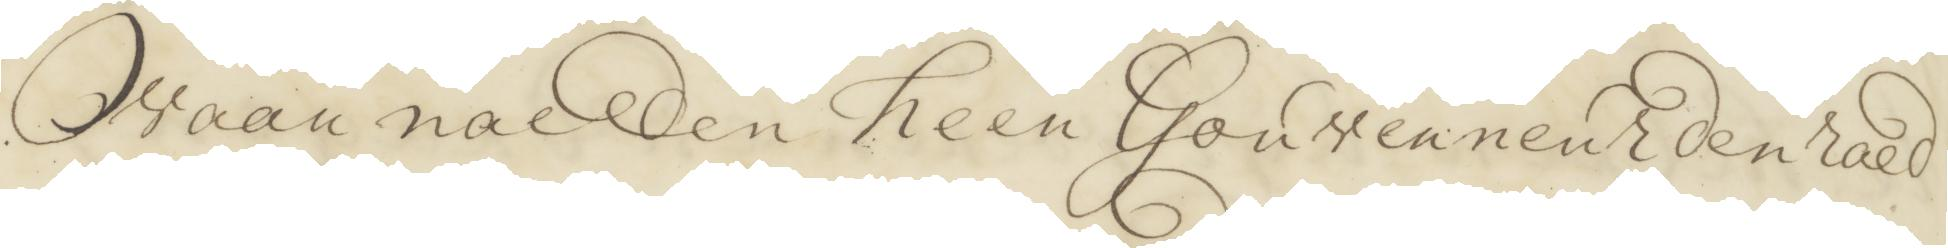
Waar nae den heer Gouverneur den raed
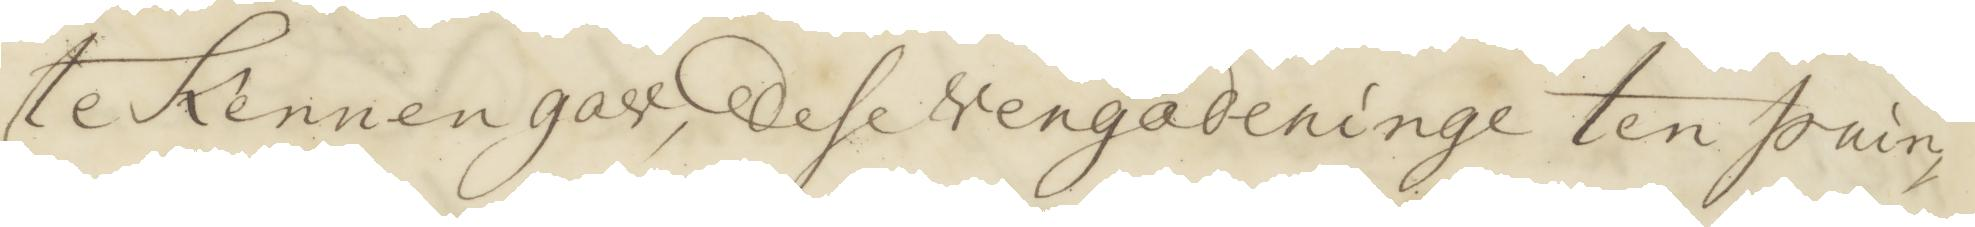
te kennen gav, dese vergaderinge ten prin„
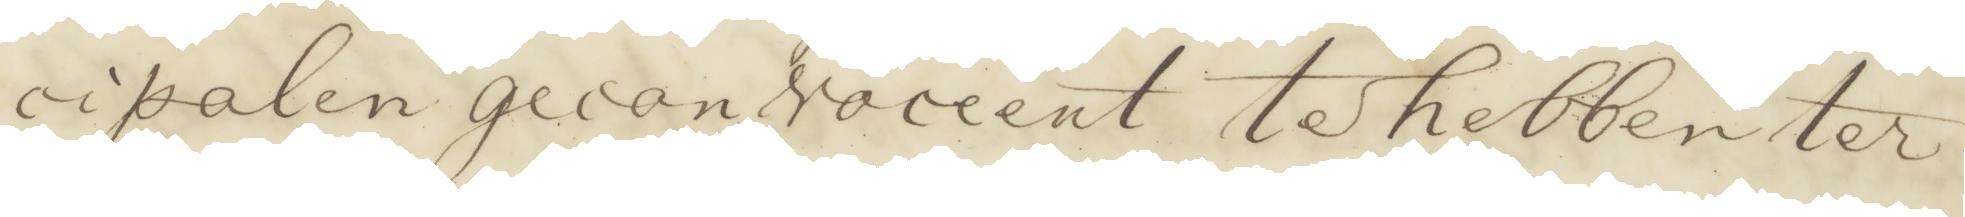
cipalen geconvoceert te hebben ter
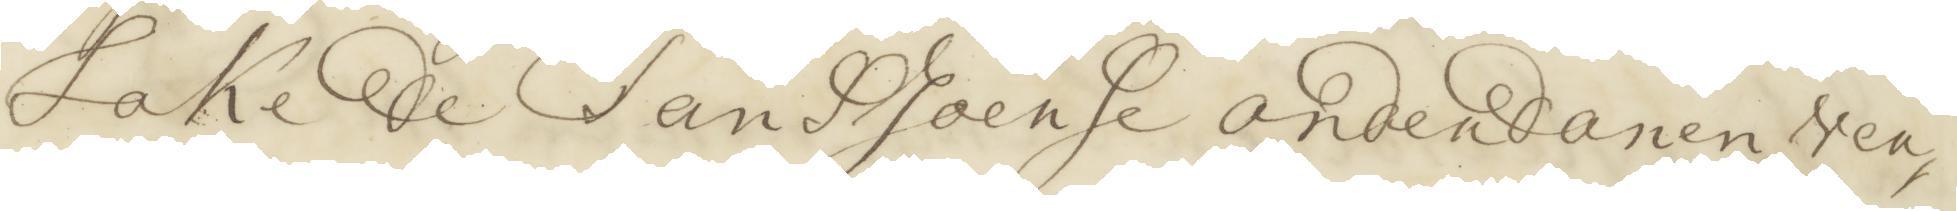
sake de Tansjoerse onderdanen ver„
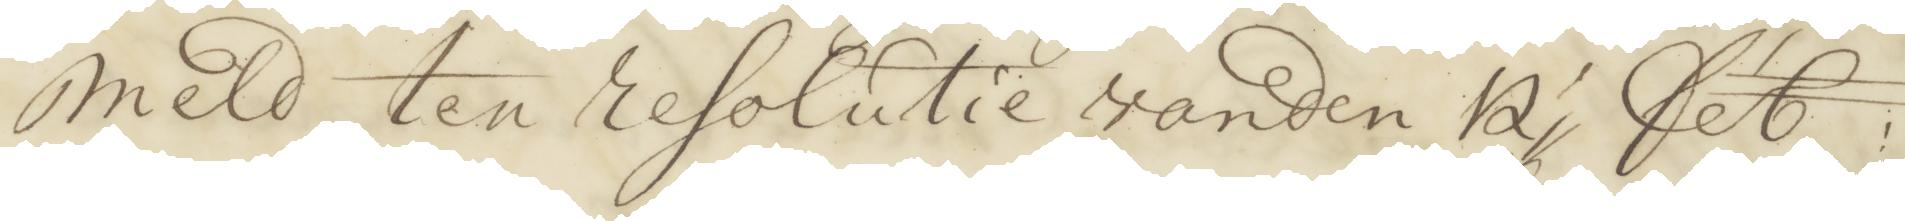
meld ter resolutie van den 12„' feb:
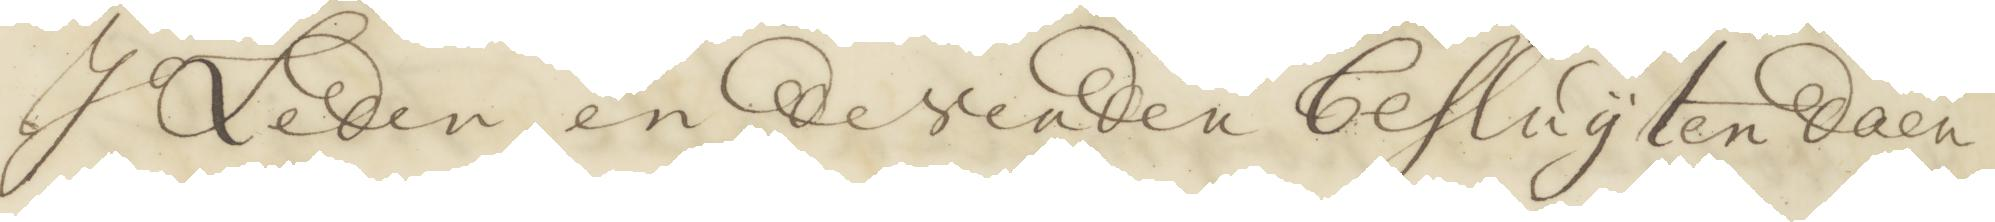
Jo Leden, en deverder besluijten daer
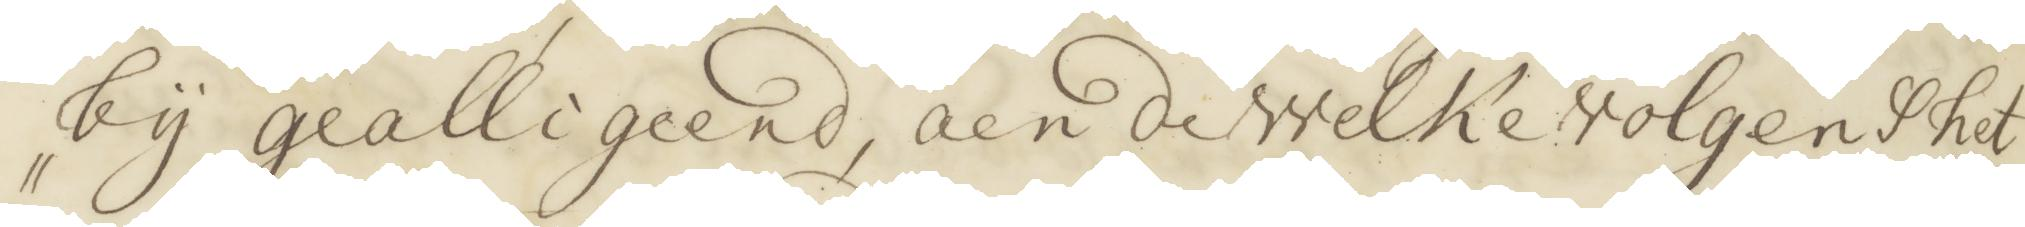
„bij gealligeerd, aen de welke volgens het
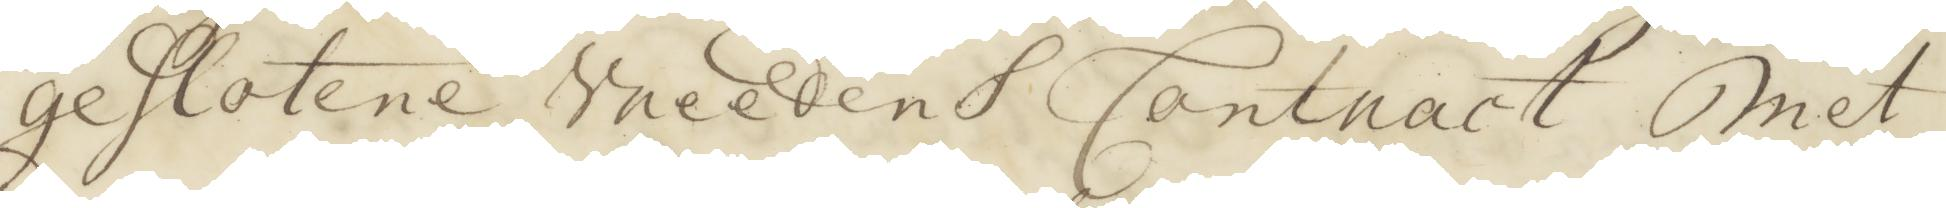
geslotene vreedens Contract met
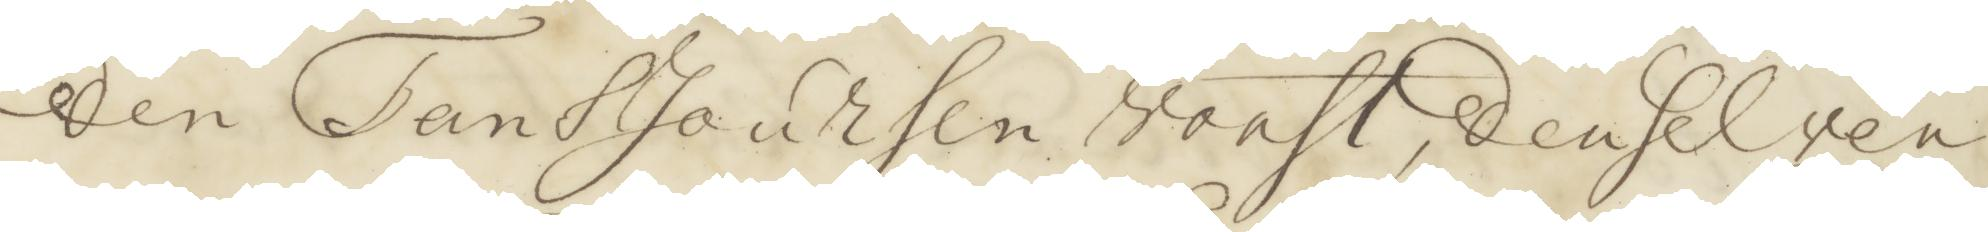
den Tansjoursen vorst, denselver
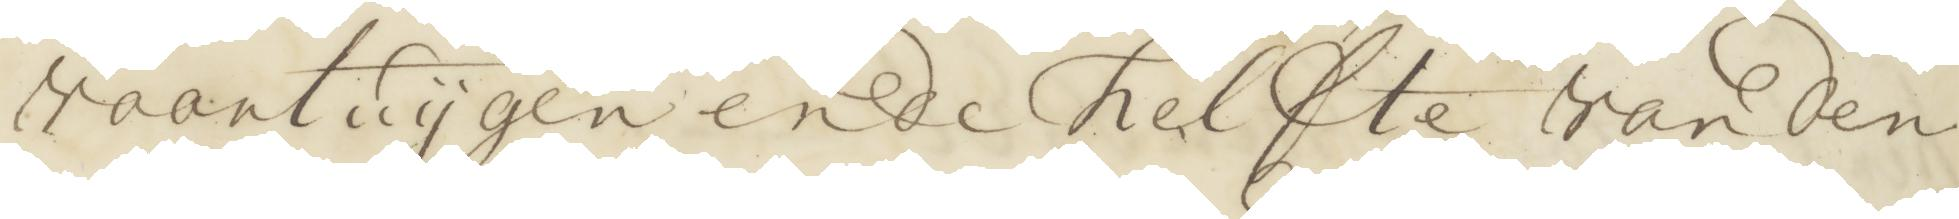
vaartuijgen en de helfte van den
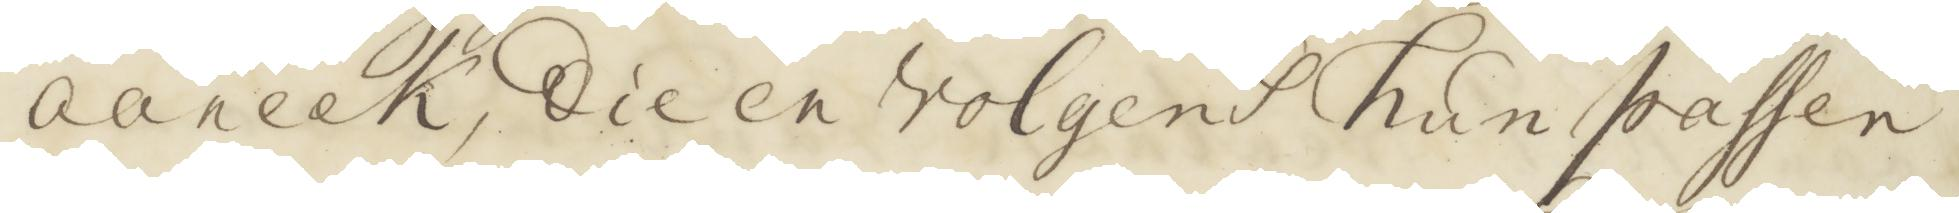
aareek, die er volgens hun passen
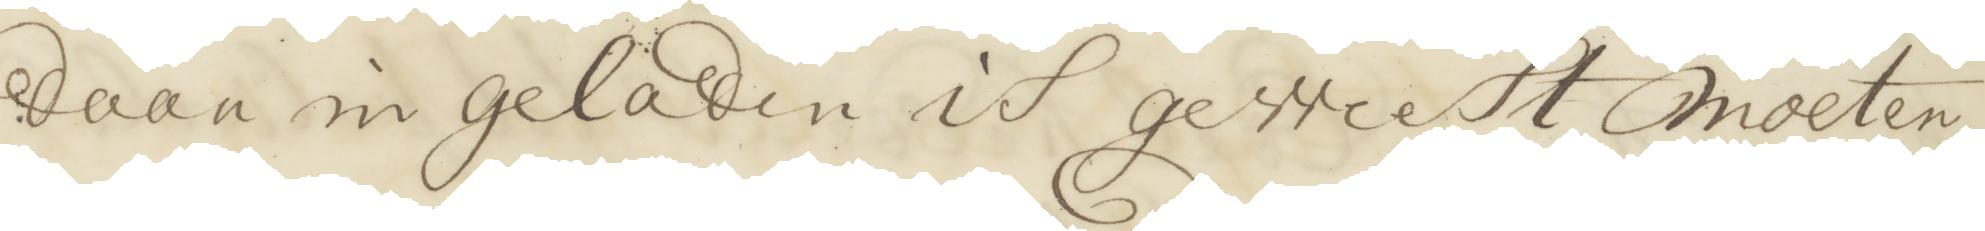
daar in geladen is geweest moeten
